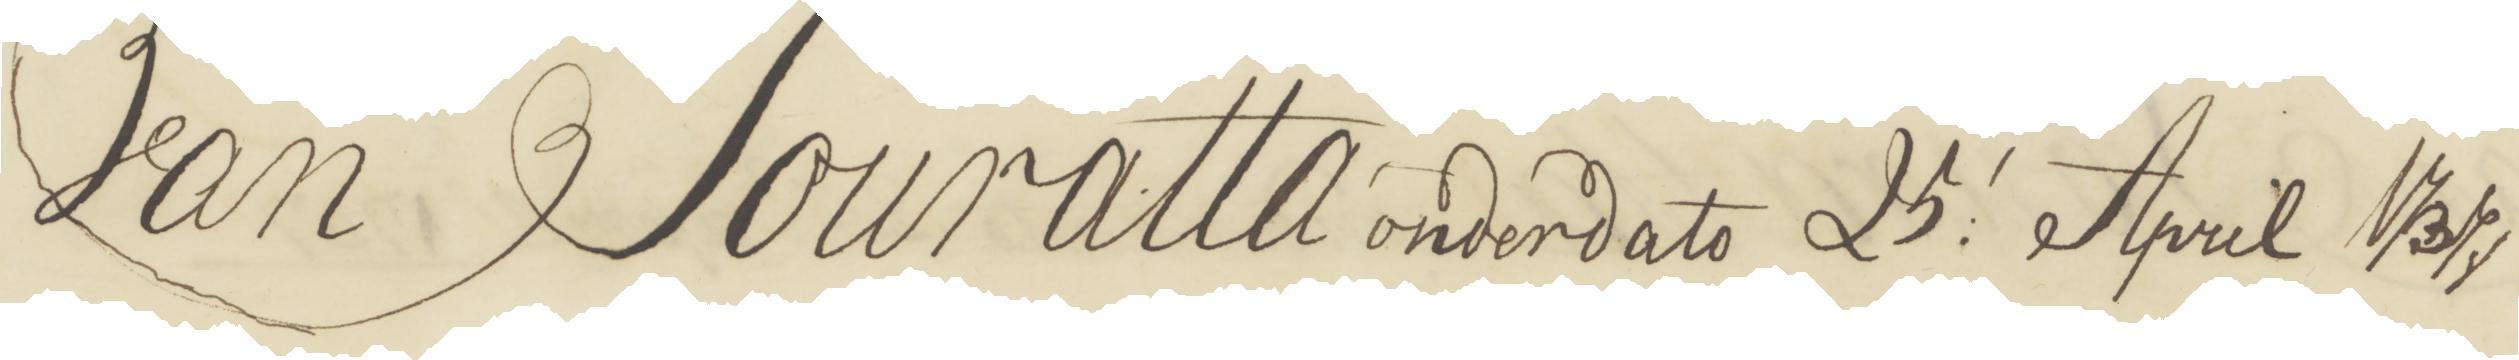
Van Souratta onderdato 25:' April 1737/
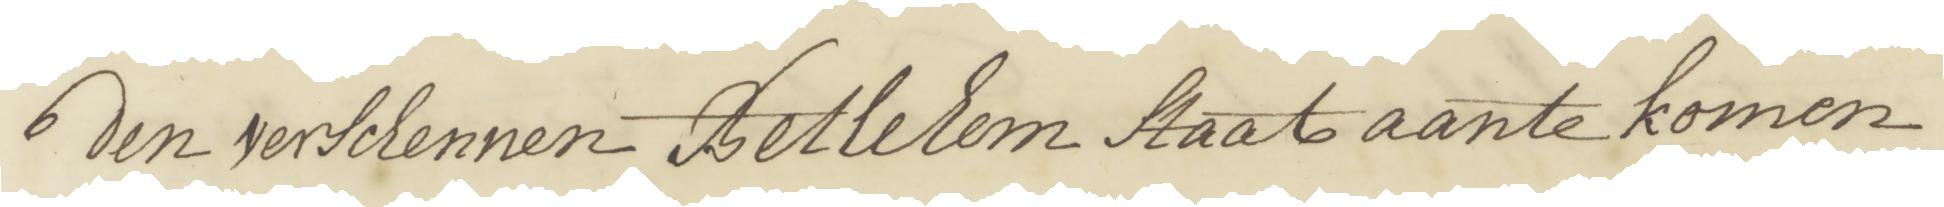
den verschennen Betlehem staat aante komen
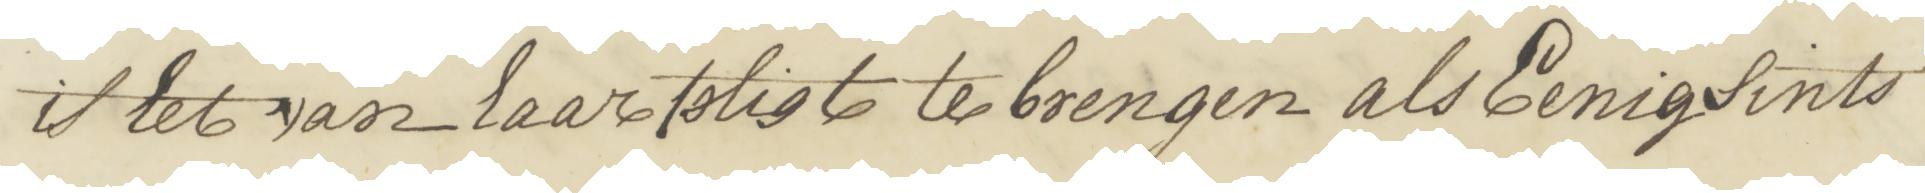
is het van haar pligt te brengen als Eenigsints
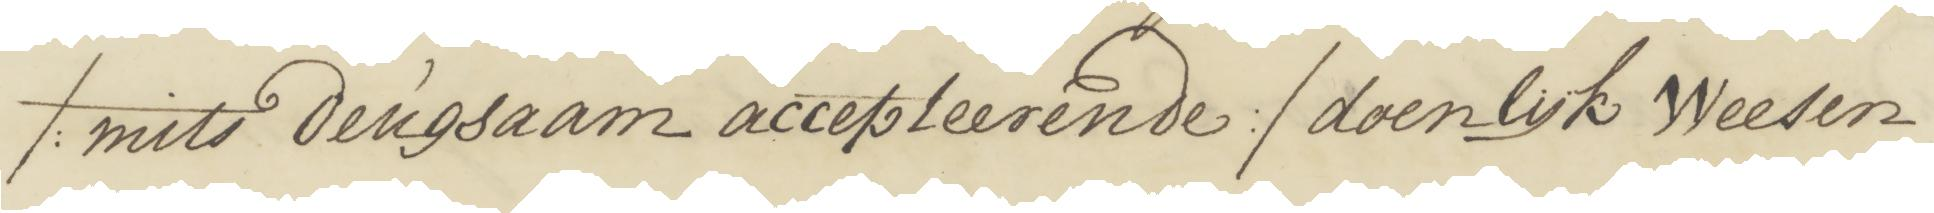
/:mits deugsaam accepteerende :/ doenlijk Weesen
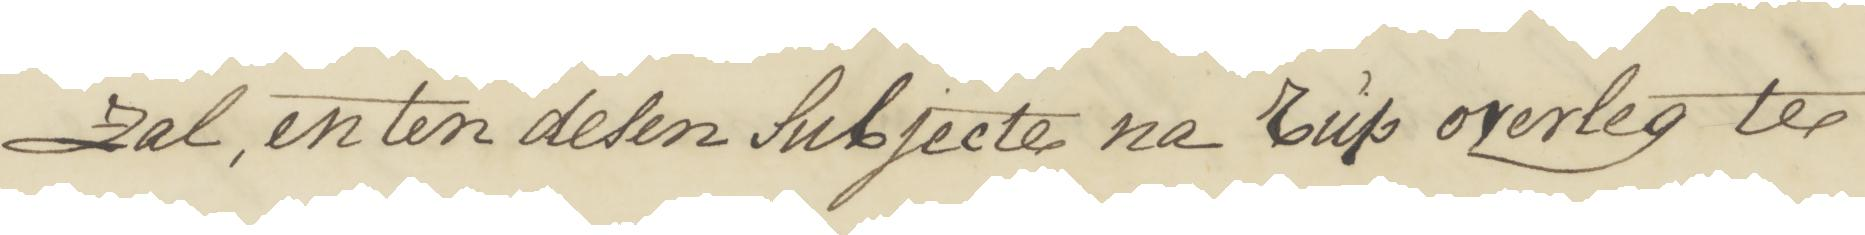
zal, en ten desen subjecte na rup overleg te
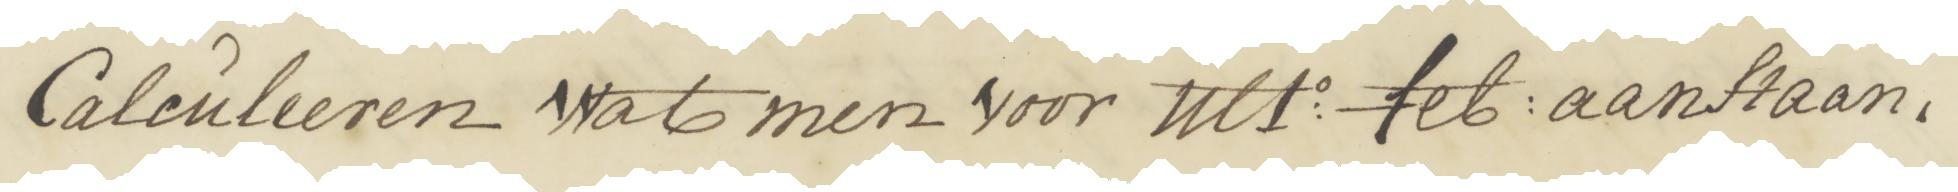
Calculeeren wat men voor ult:o feb: aanstaan„
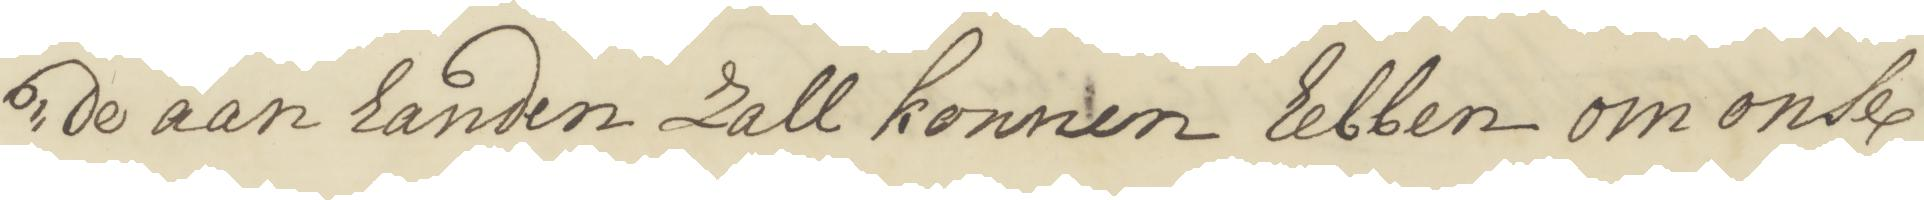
de aan handen zall konnen hebben om onse
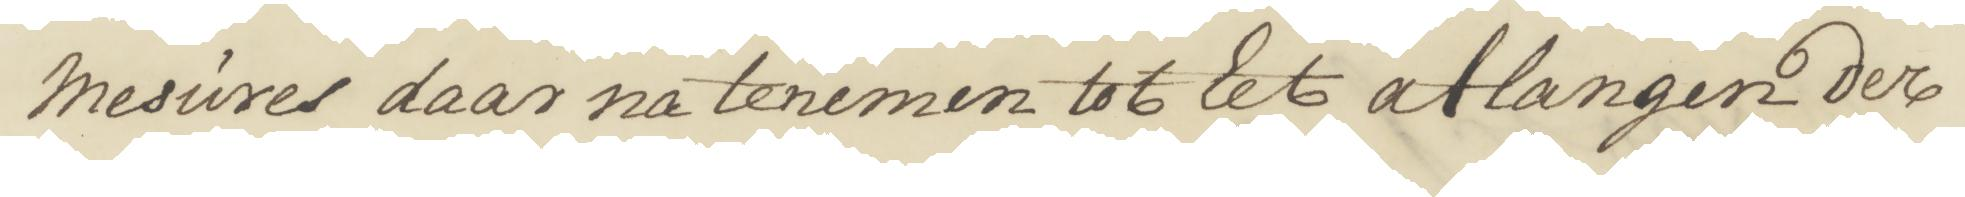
mesures daar na tenemen tot het aflangen der
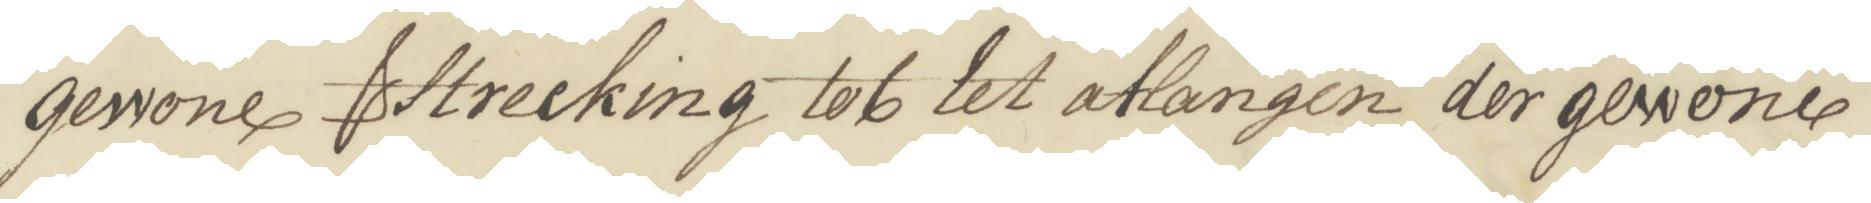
gewone verstrecking tot het aflangen der gewone
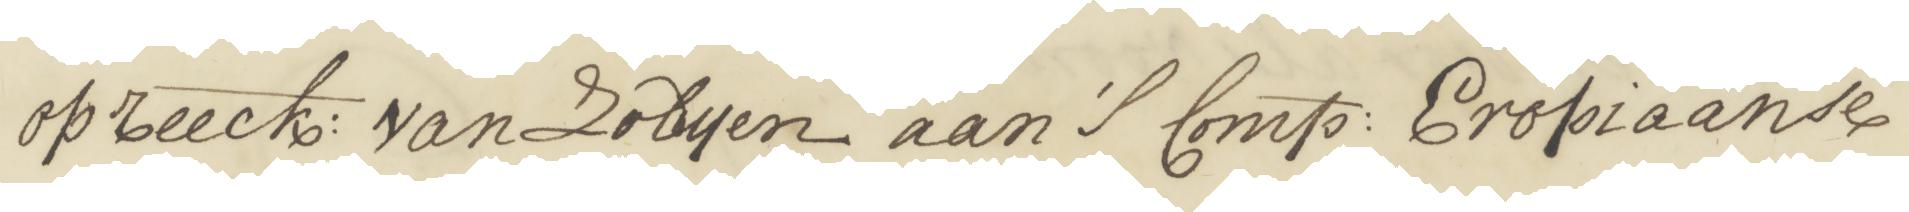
op reeck: van zobyen aan ’s Comp: Eropiaanse
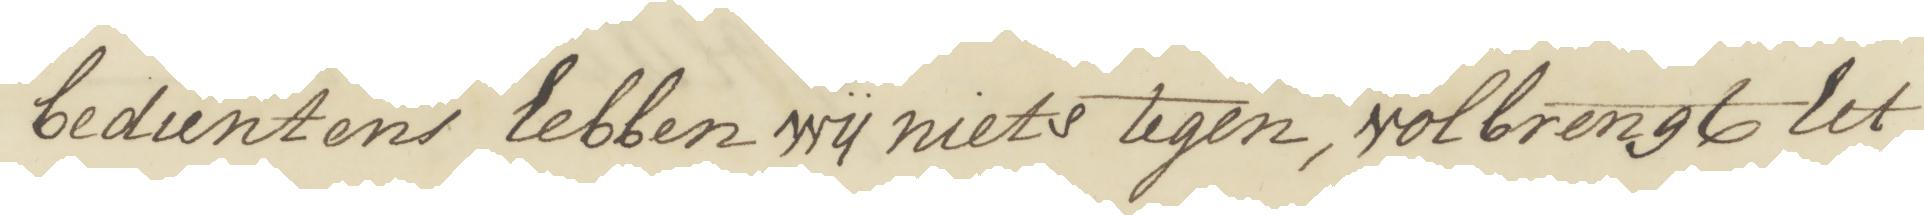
bedientens hebben wij niets tegen, volbrengt het
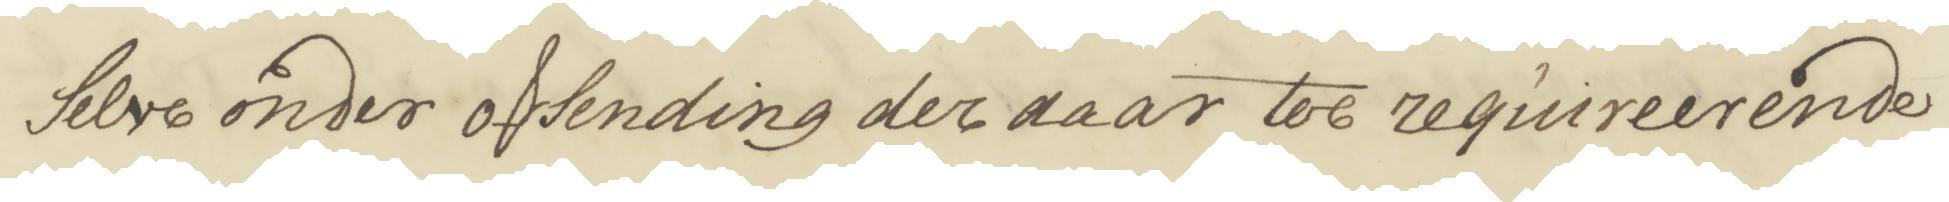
selve onder oversending der daar toe requireerende
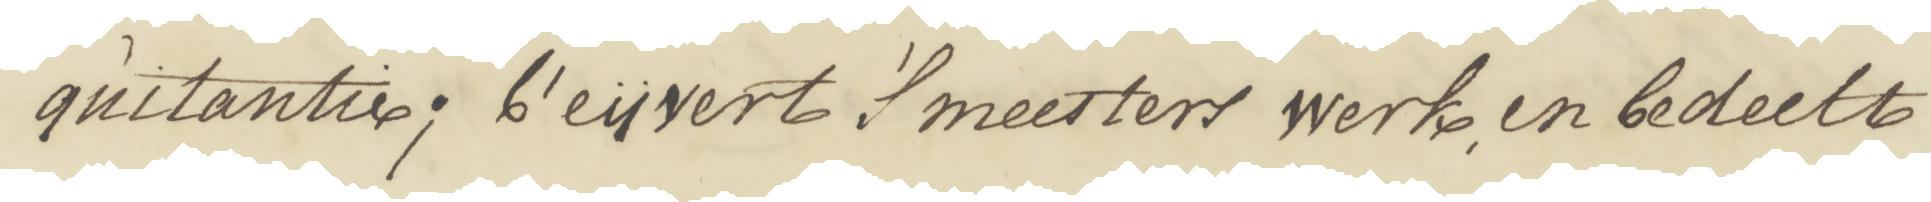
quitantie; b'eijvert 's meesters werk in bedeelt
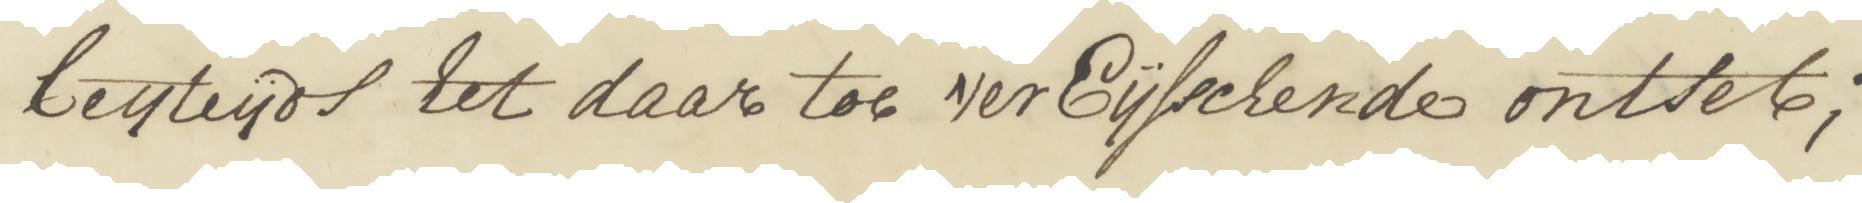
beyteijds het daar toe verEijsschende ontset;
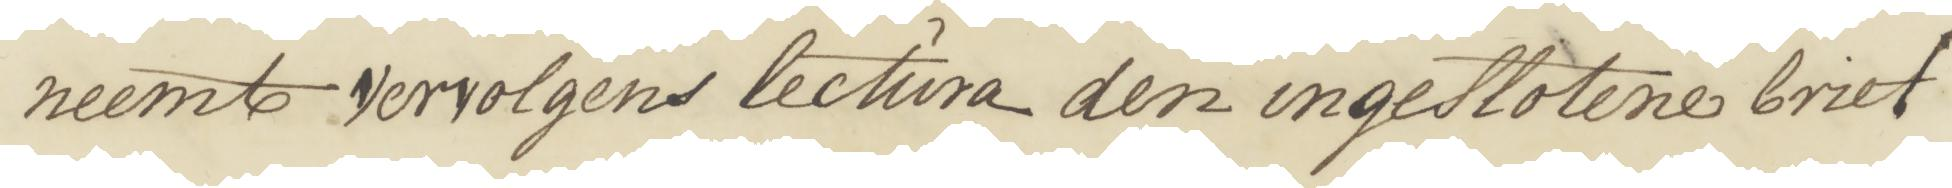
neemt vervolgens lectura den ingeslotene brief
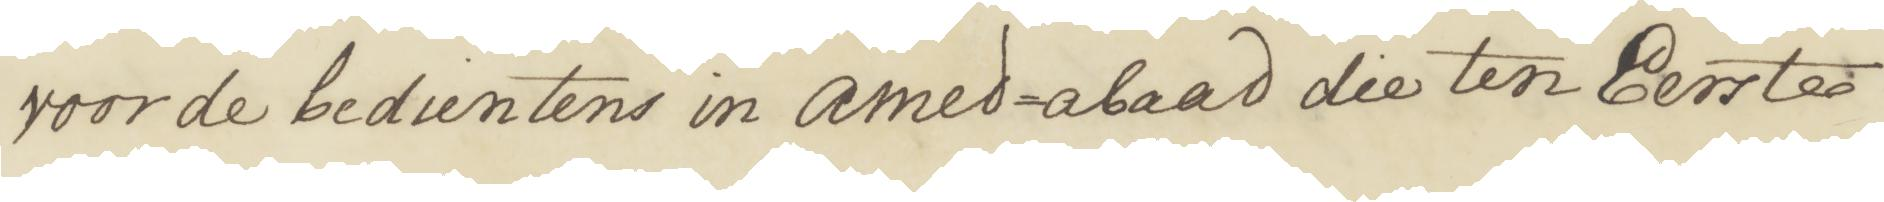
voor de bedientens in amed=abaad die ten Eerste
